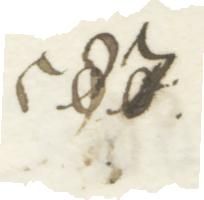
587:
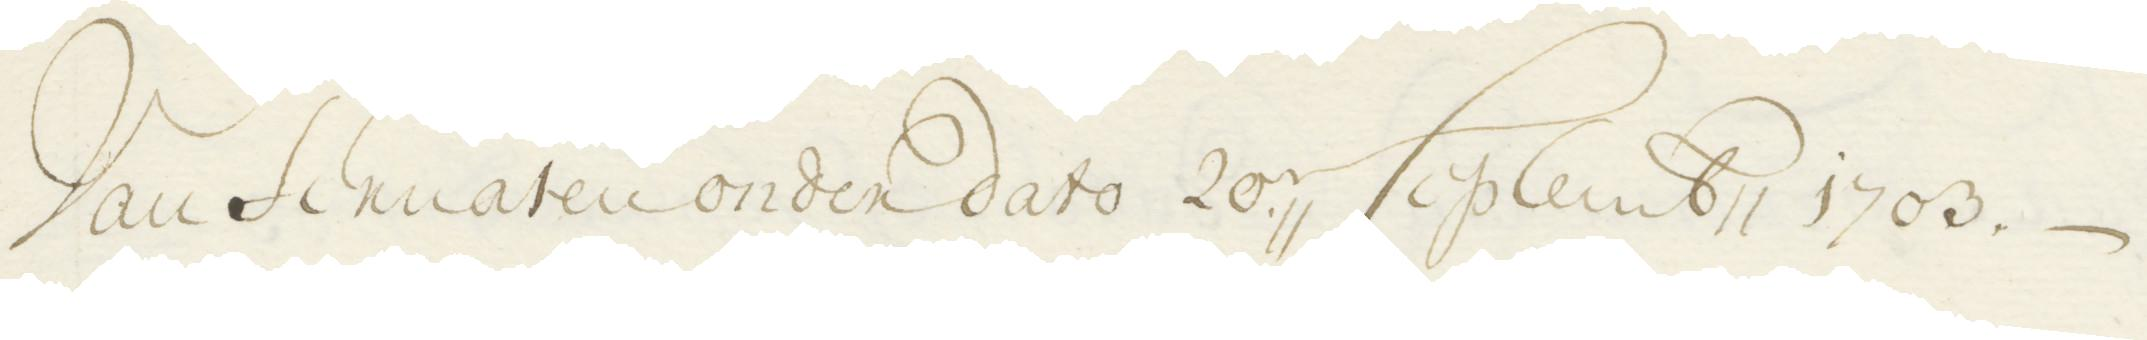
Van Ternaten onder dato 20.„' Septemb„ 1703. —
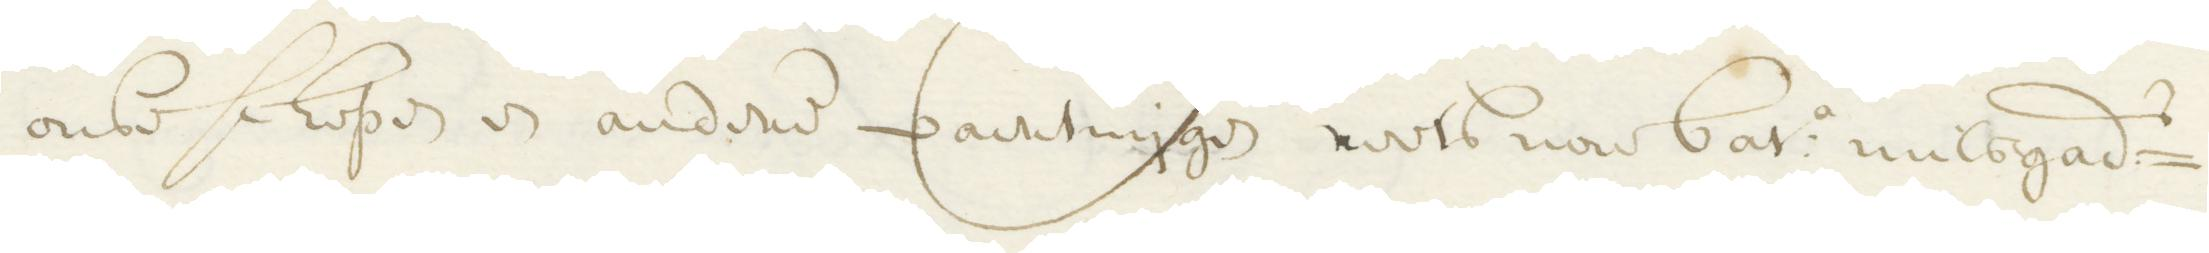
onse schepen en andere vaertuijgen reets nae bat:a mitsgad.=s
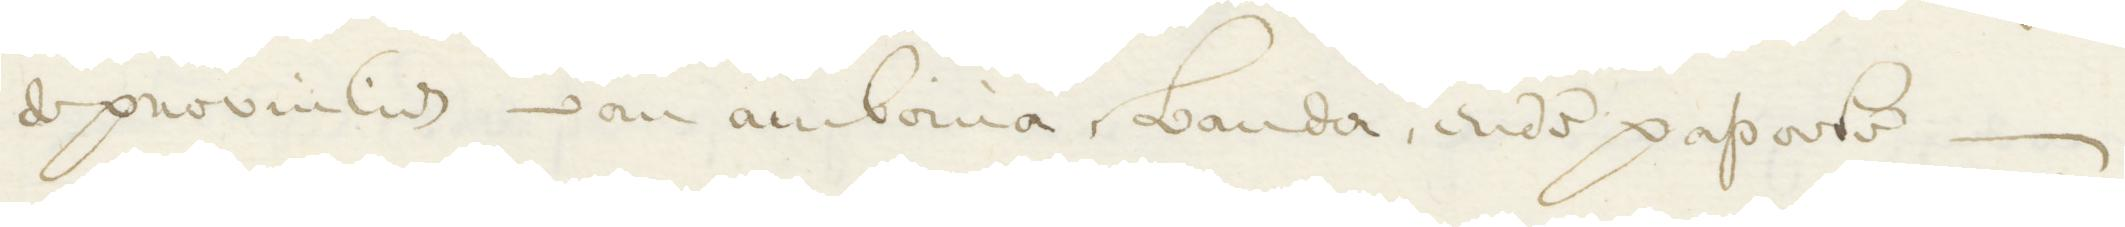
de provintien van amboina, banda, ende papoese —
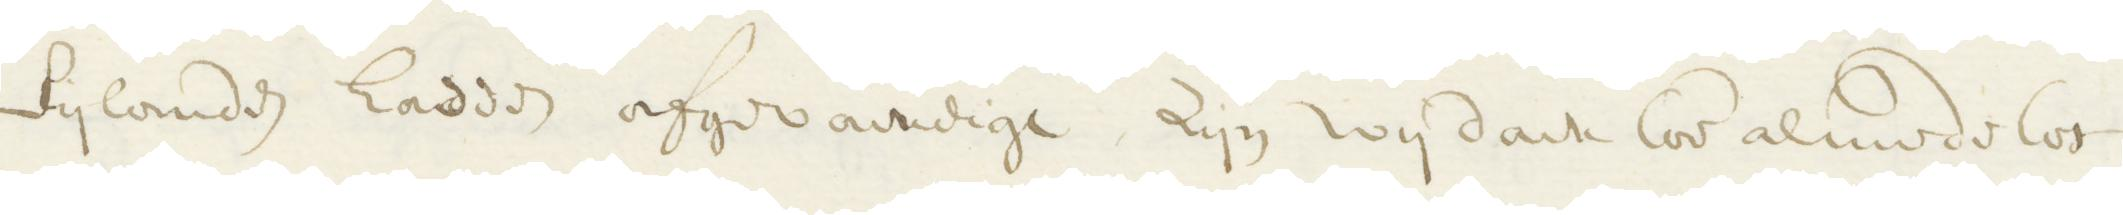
Eijlanden hadden afgevaerdigt zijn wij daer toe almede tot
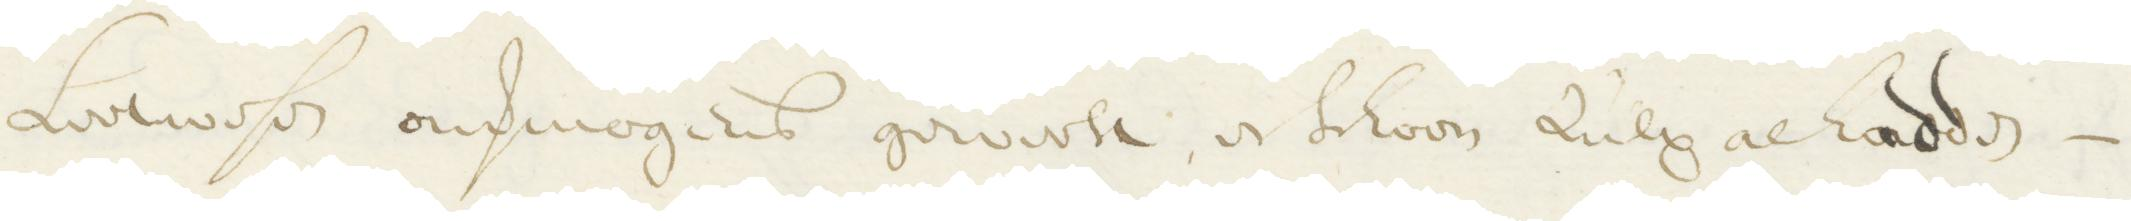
Leetwesen onvermogens geweest, en schoon zulx alhadden —
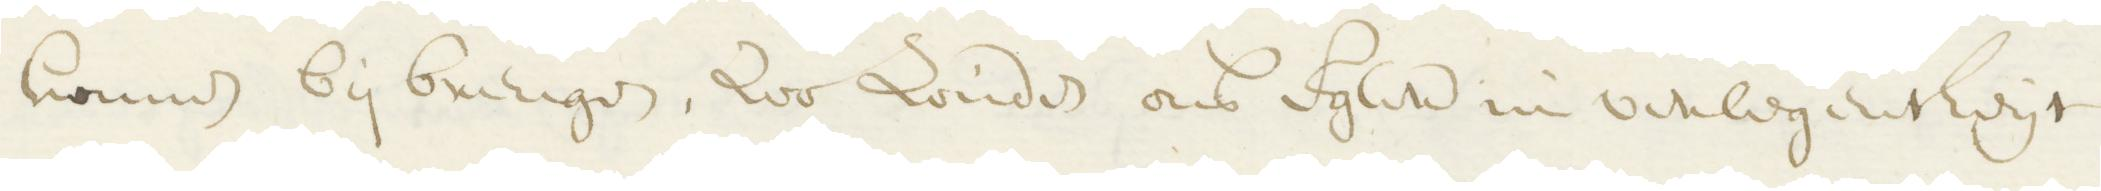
konnen bij brengen, zoo zouden ons Egter in verlegentheijt
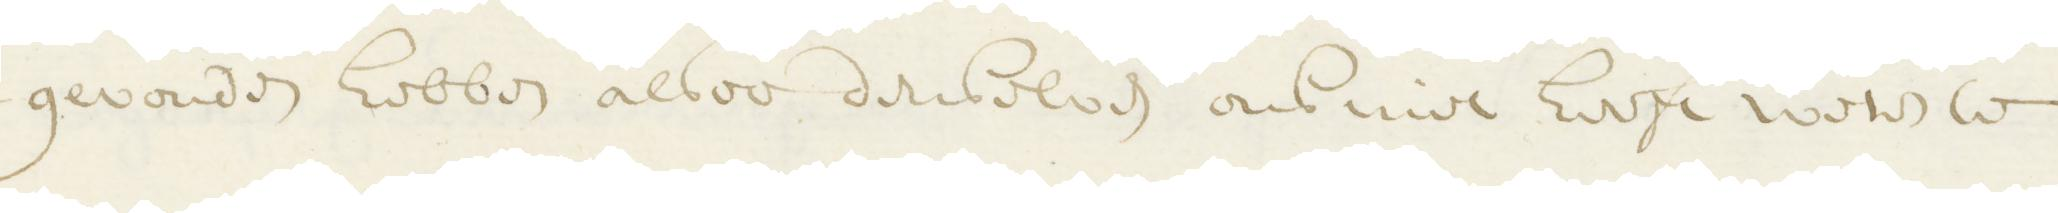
gevonden hebben alsoo denselven ons niet heeft weten te
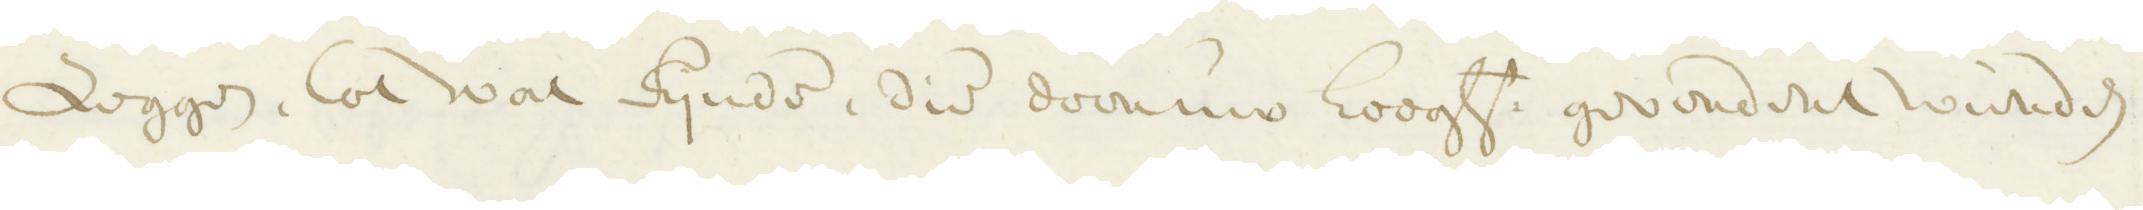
zeggen, tot wat Eijnde, die door uw hoogh:t gevordert wierden
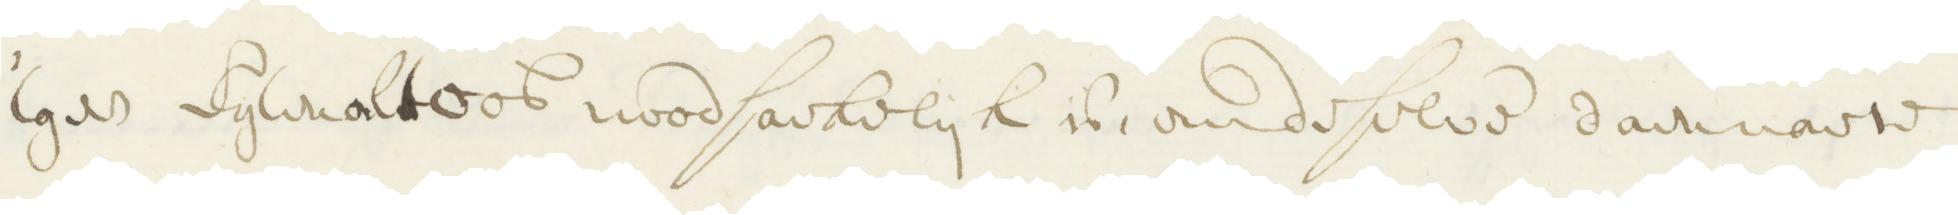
'tgeen Egter altoos noodsaekelijk is, om deselve daer nae te
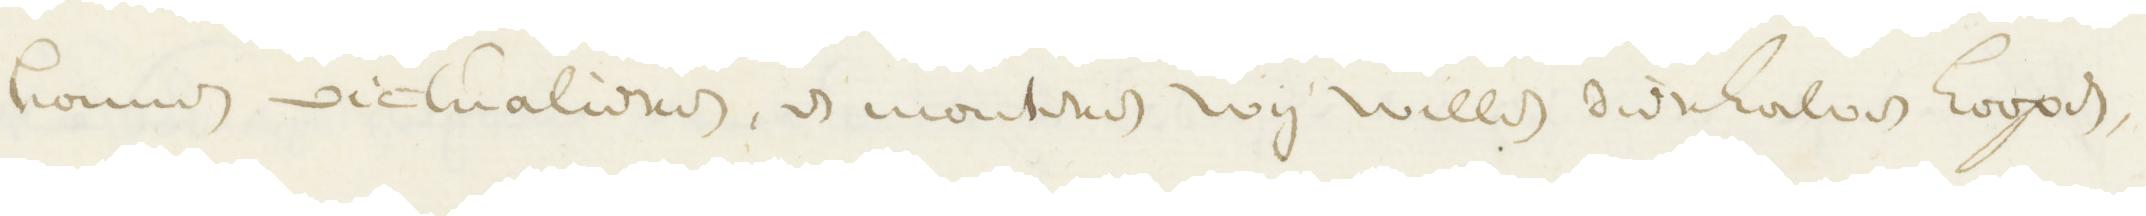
konnen victualieren, en monteren wij willen dierhalven hoopen,
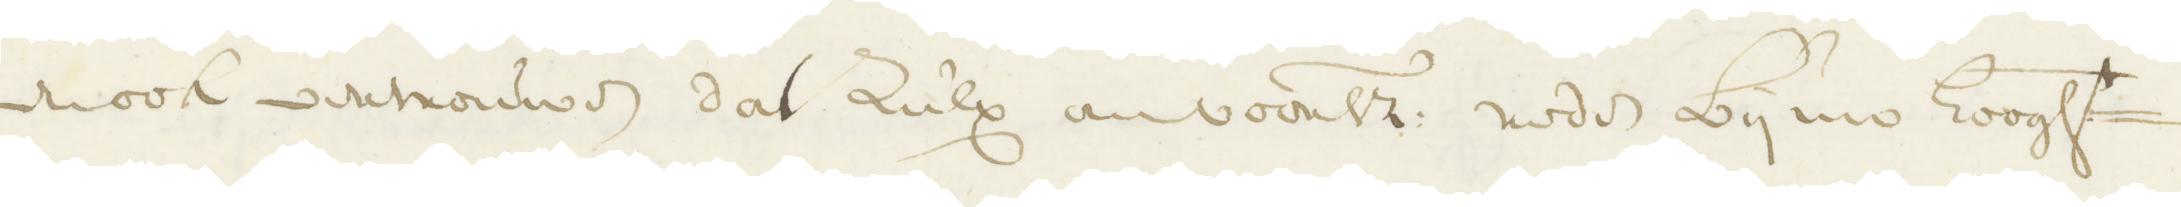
en ook vertrouwen dat zulx om voorsz: reden bij uw hoogh=t
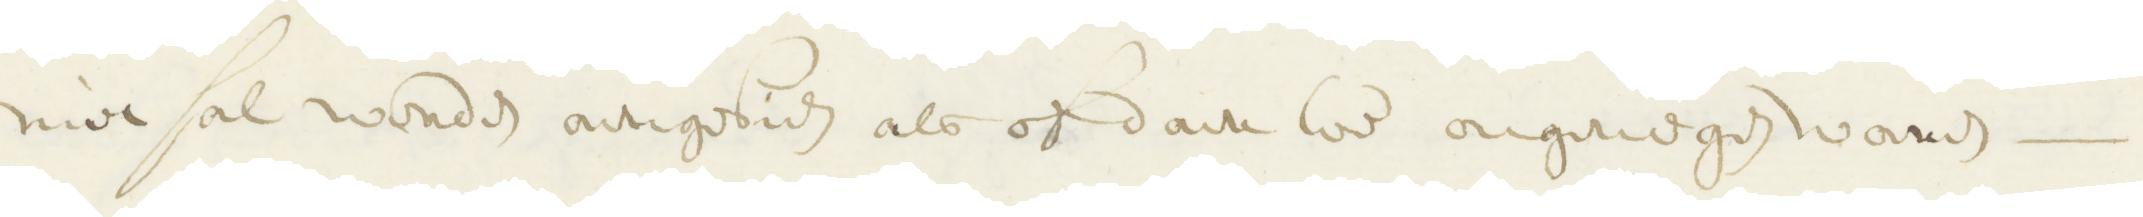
niet sal werden aengesien als of daer toe ongenegen waren —
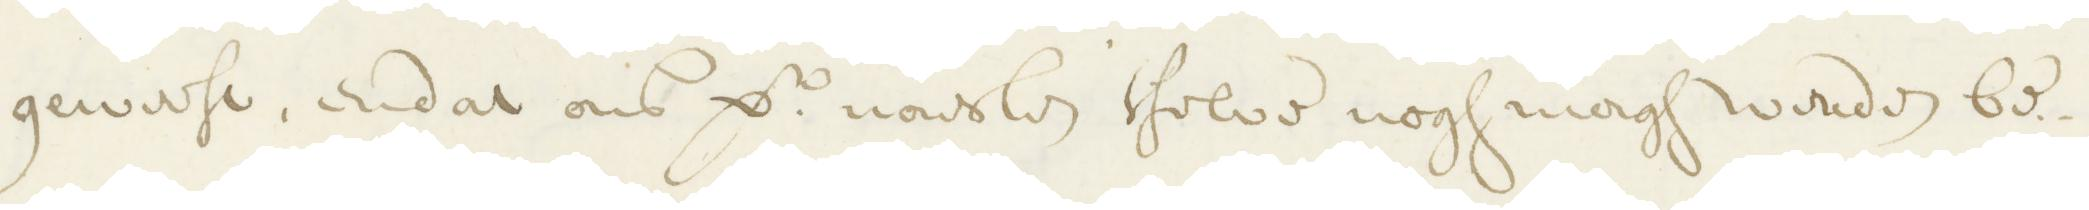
geweest, en dat ons p.r naesten 'tselve nogh magh werden be.-
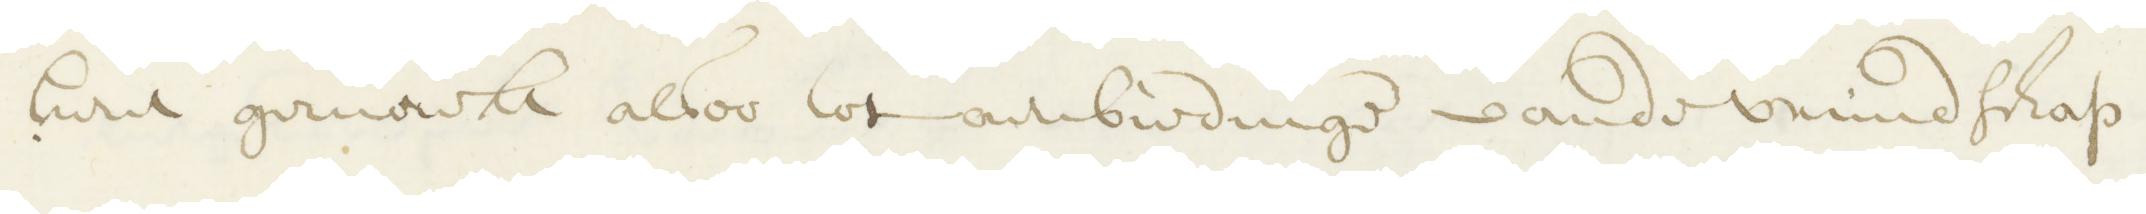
kent gemaekt alsoo tot aenbiedinge vande vrundschap
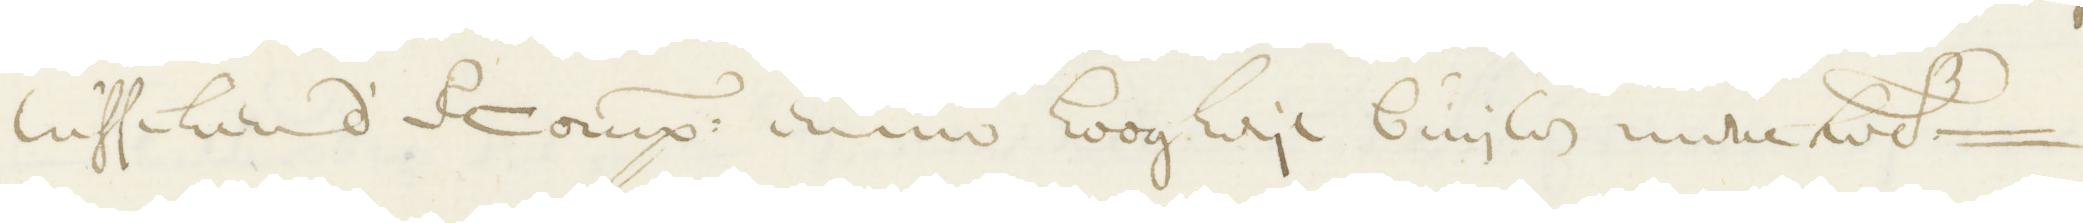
tusschen d’ Ecomp: en uw hoogheijt buijten merckelijk =
